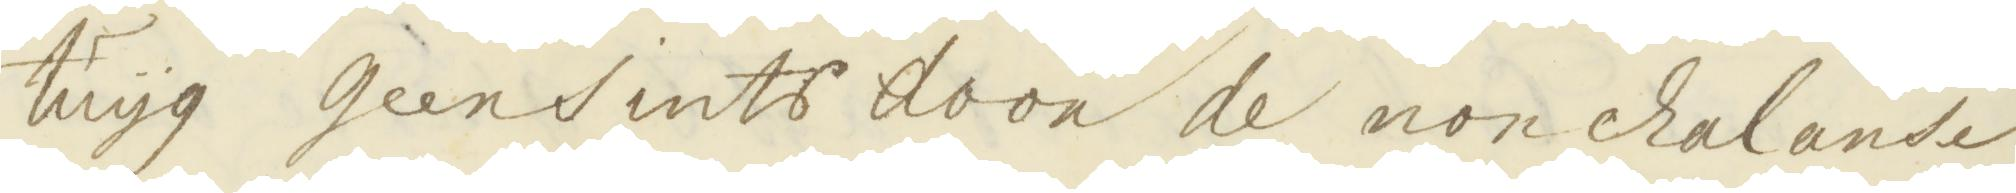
tuijg geensints door de nonchalanse
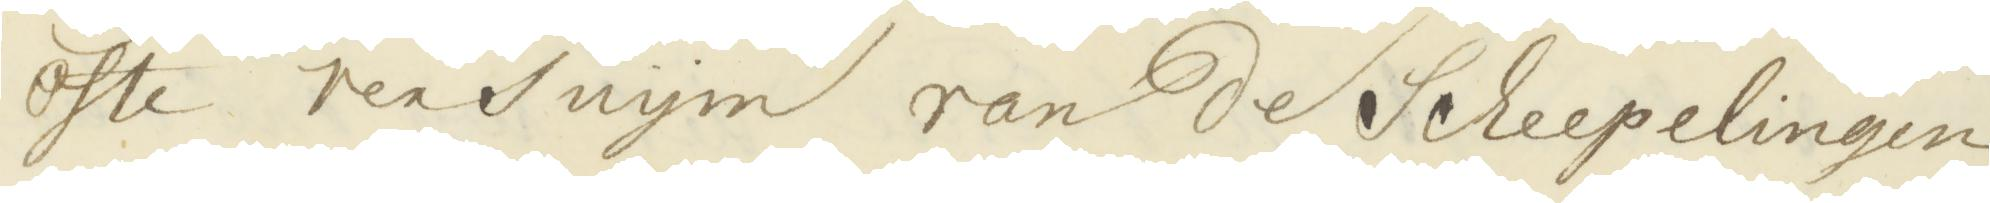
ofte versuijm van de Scheepelingen
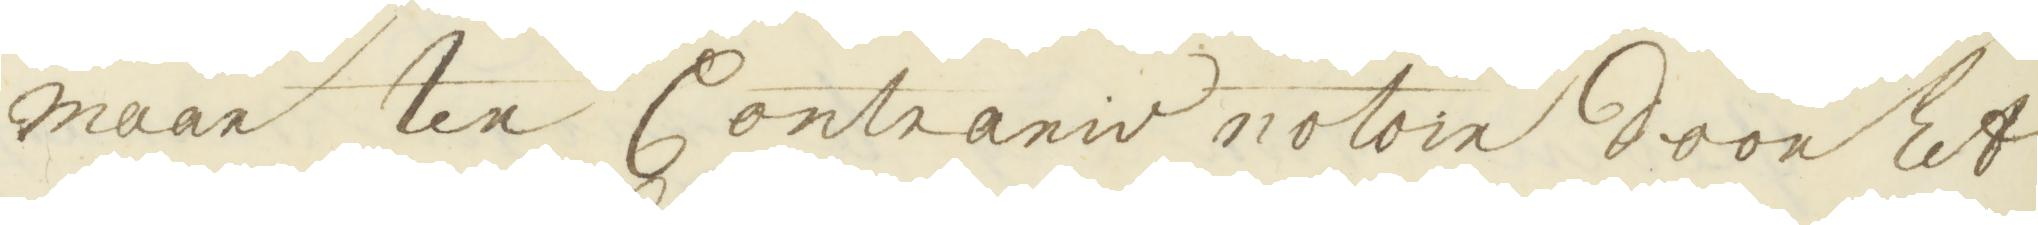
maar ter Contrarie notoir door het
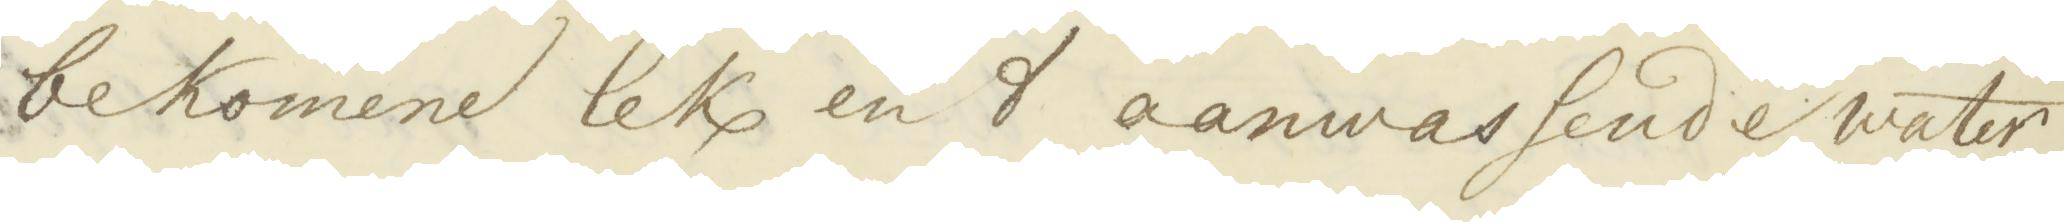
bekomene lek en ’t aanwassende water
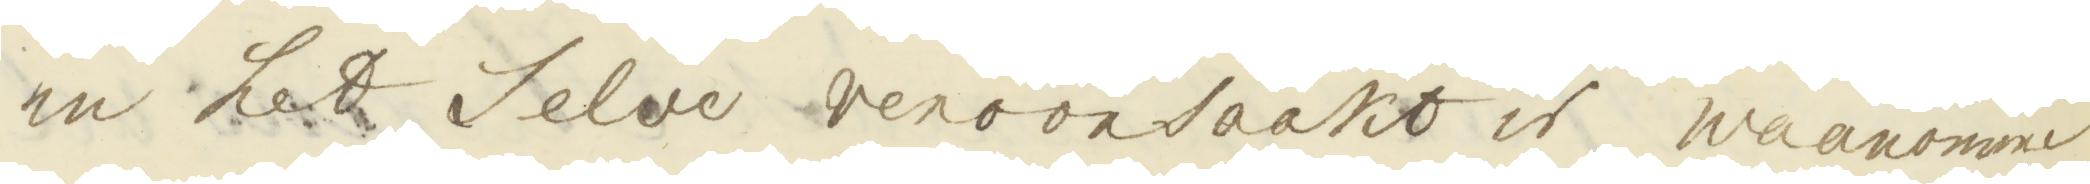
in het Selve veroorsaakt is waaromme
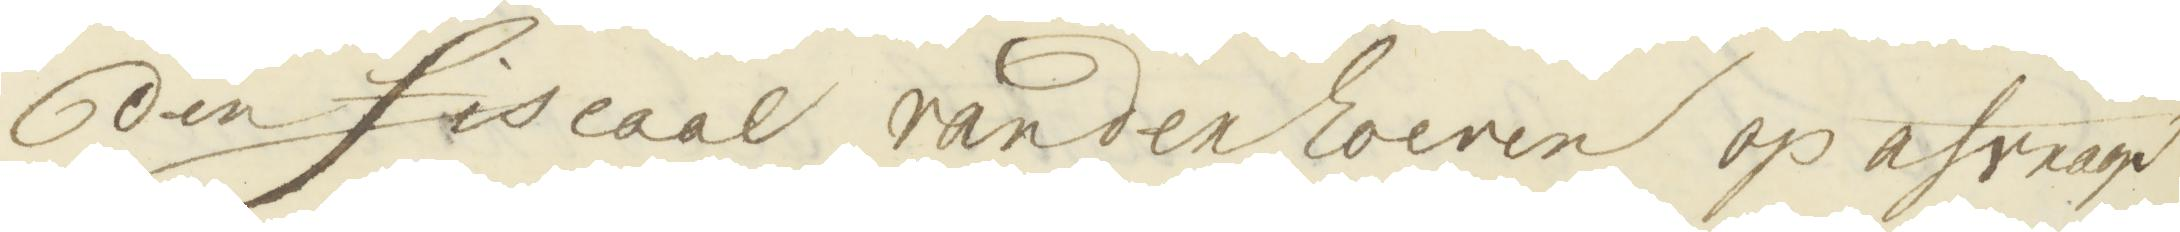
den Fiscaal van der hoeven op afvrage
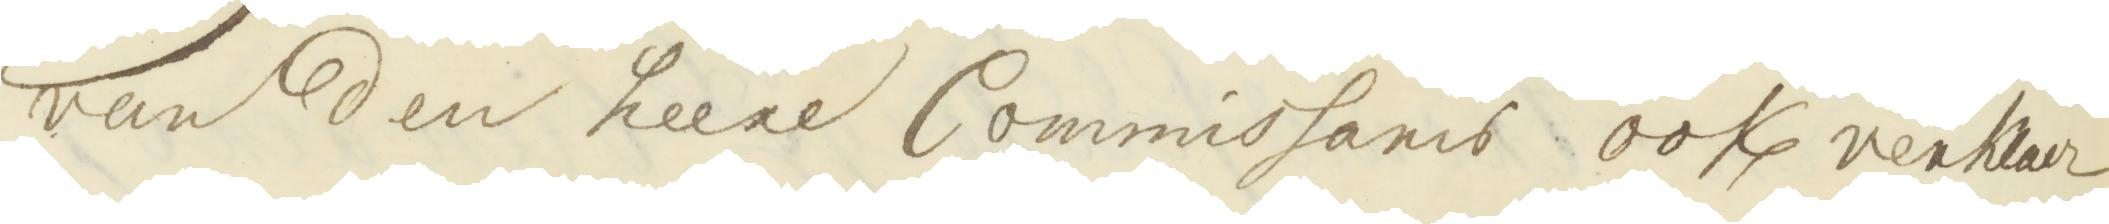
van den heere Commissaris ook verklaer
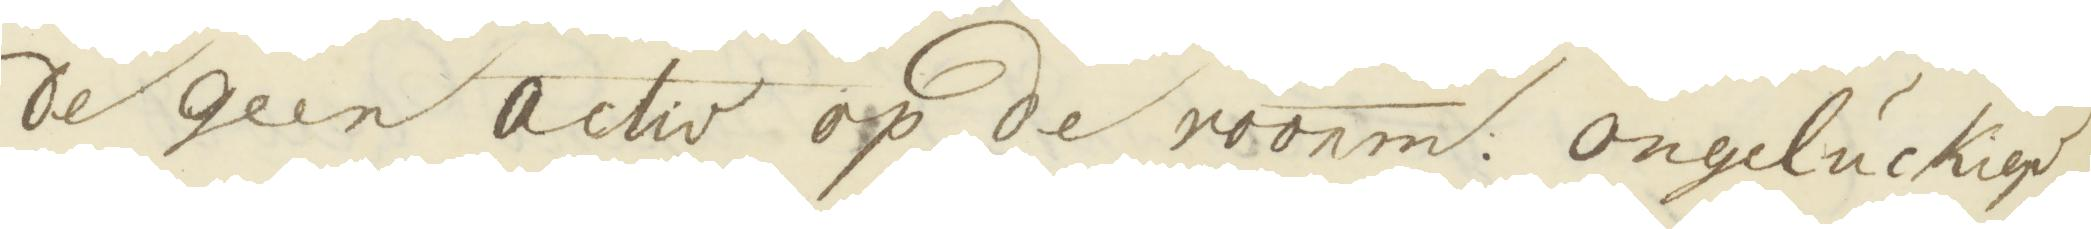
de geen actie op de voorm: ongeluckige
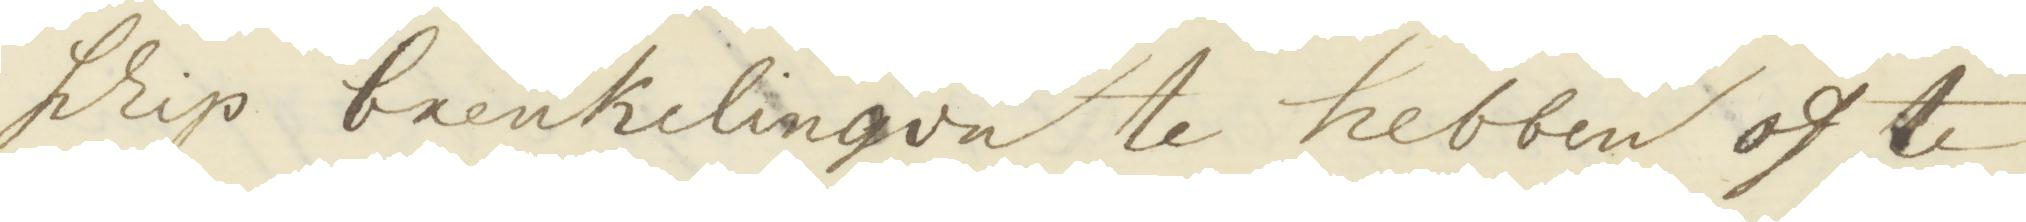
schip brenkelingen te hebben of te
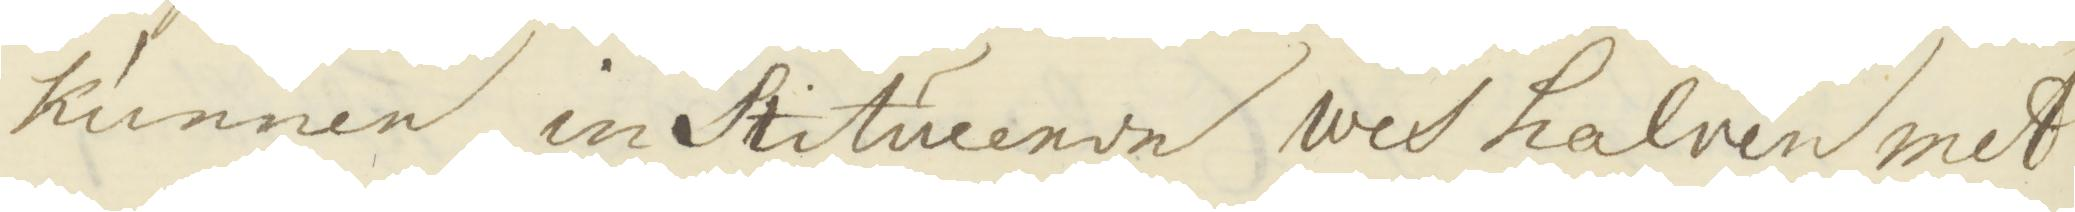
kunnen in stitueeren wes halven met
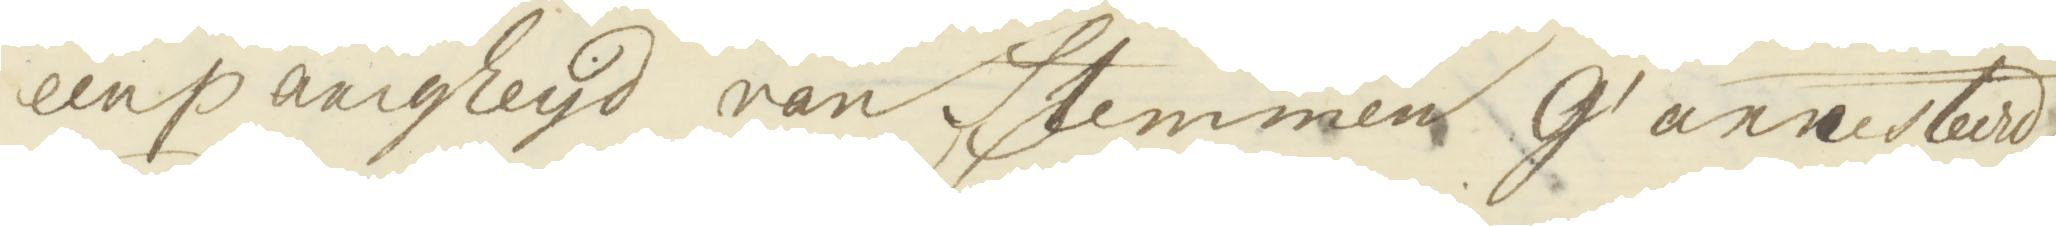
een parigheijd van Stemmen g’arresteerd
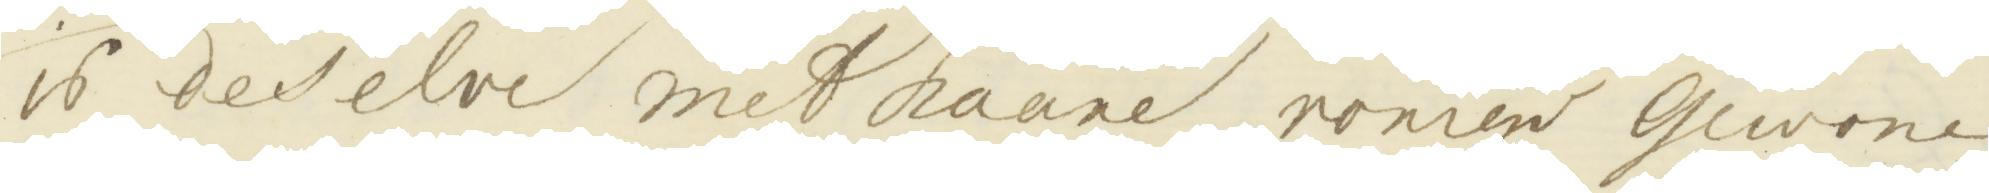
is deselve met haare vorige gewone
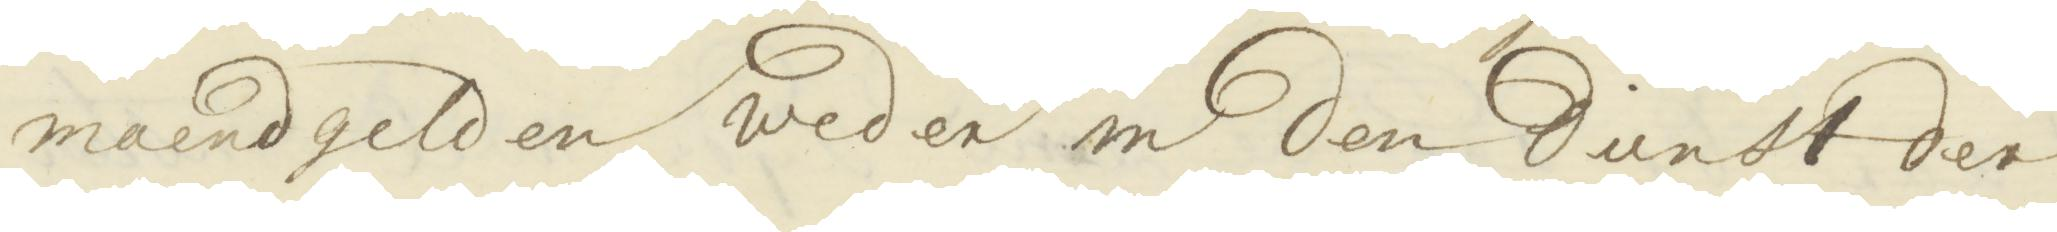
maendgelden weder in den dienst der
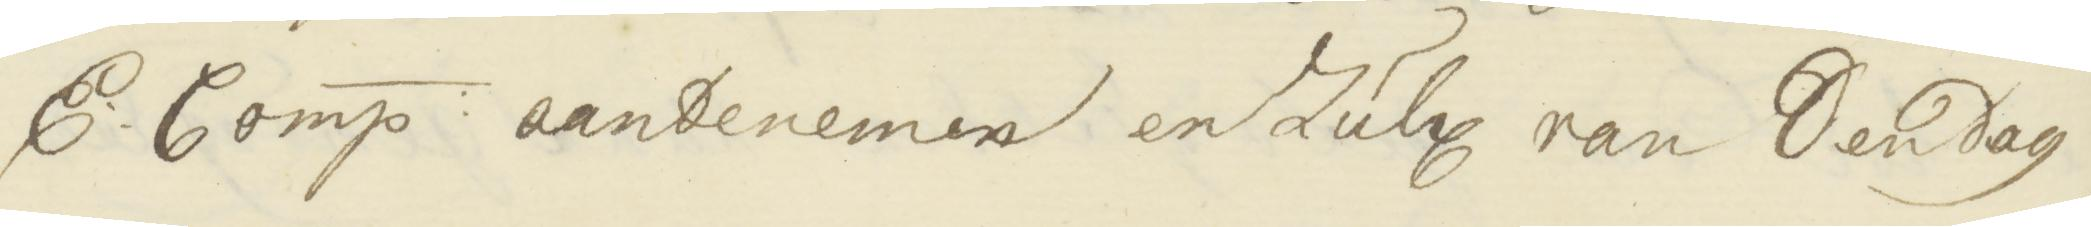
E: Comp: aantenemen en Zulx van den dag
